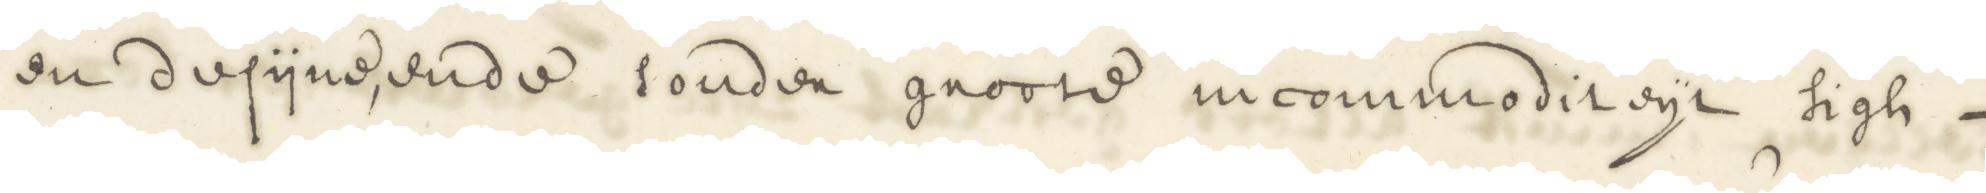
en desijne, ende sonder groote incommoditeijt sigh
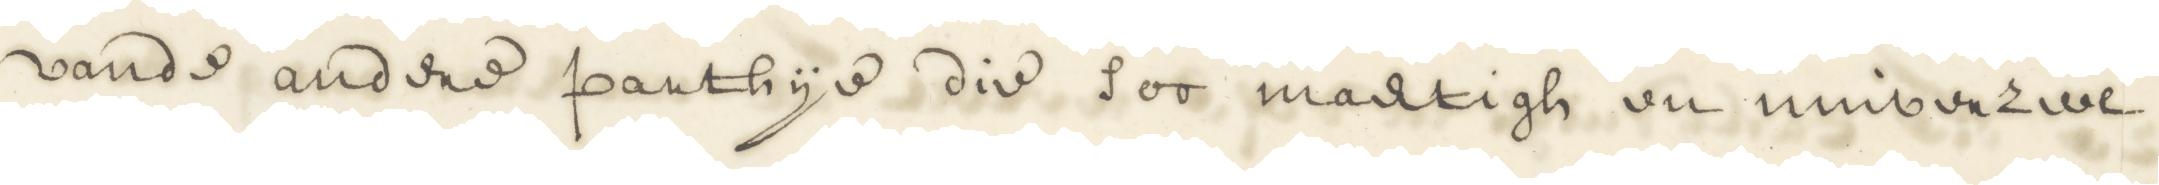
vande andere parthije die soo machtigh en univerzeel
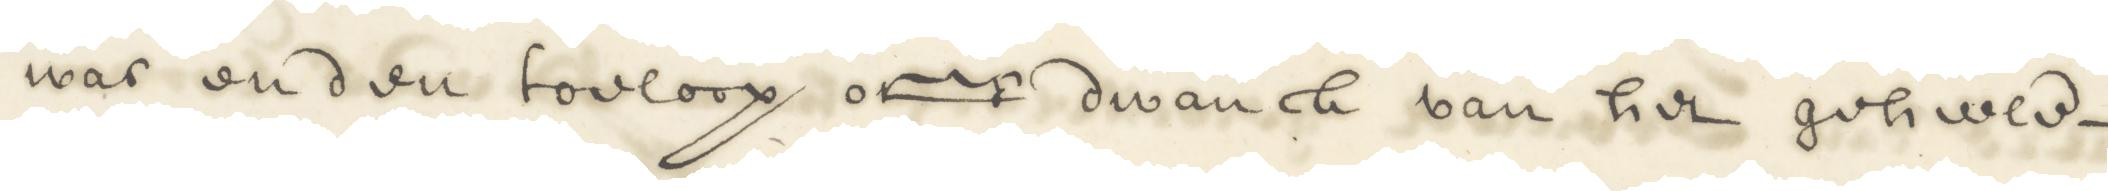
was en den toeloop off dwanck van het geheele–
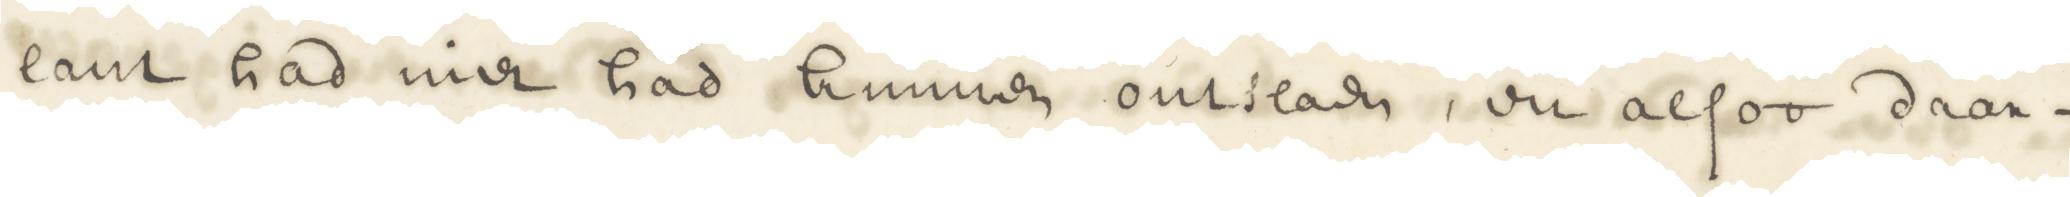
lant had niet had kunnen ontslaen, en alsoo daar –
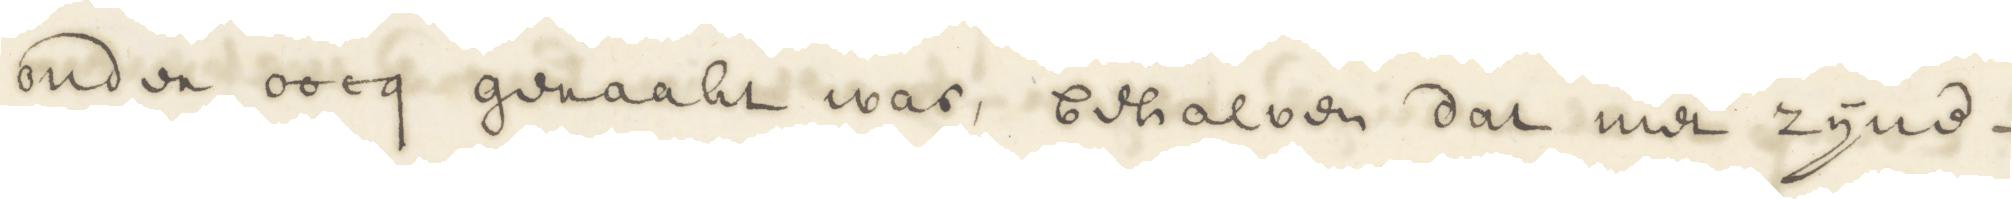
onder oocq geraakt was, behalven dat met zijne
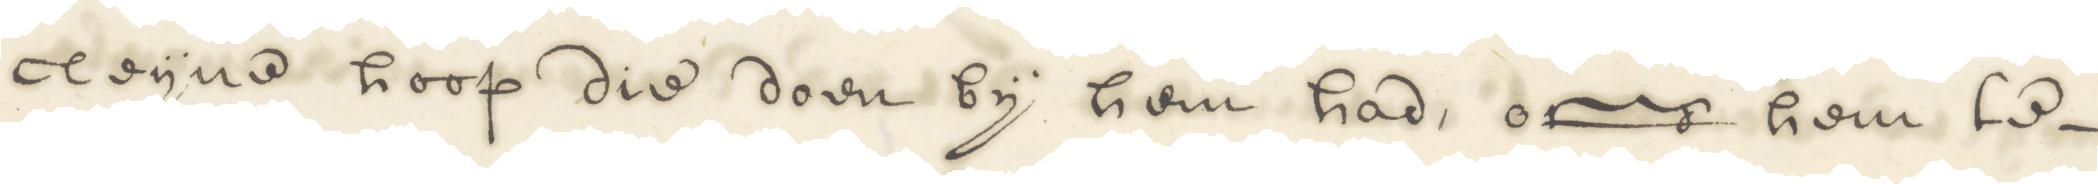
cleijne hoop die doen bij hem had, off hem te –
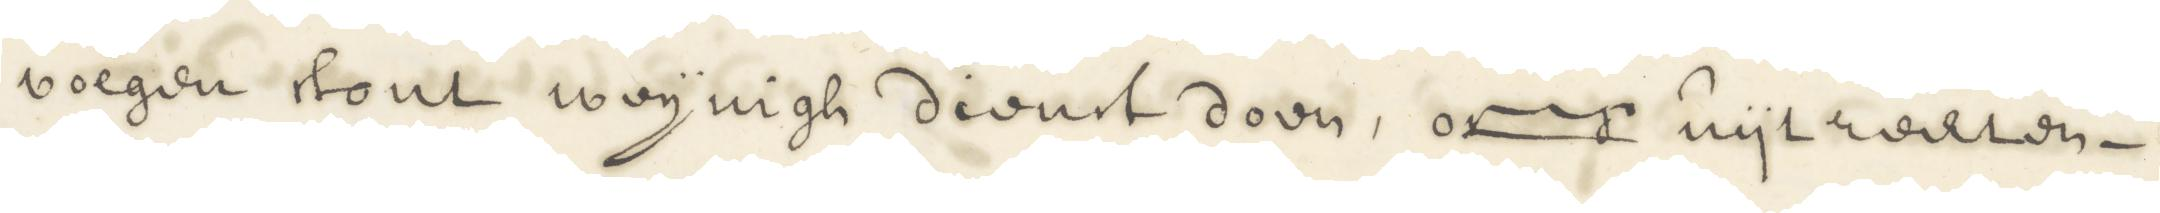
volgen stont weijnigh dienst doen, off uijt reeten –
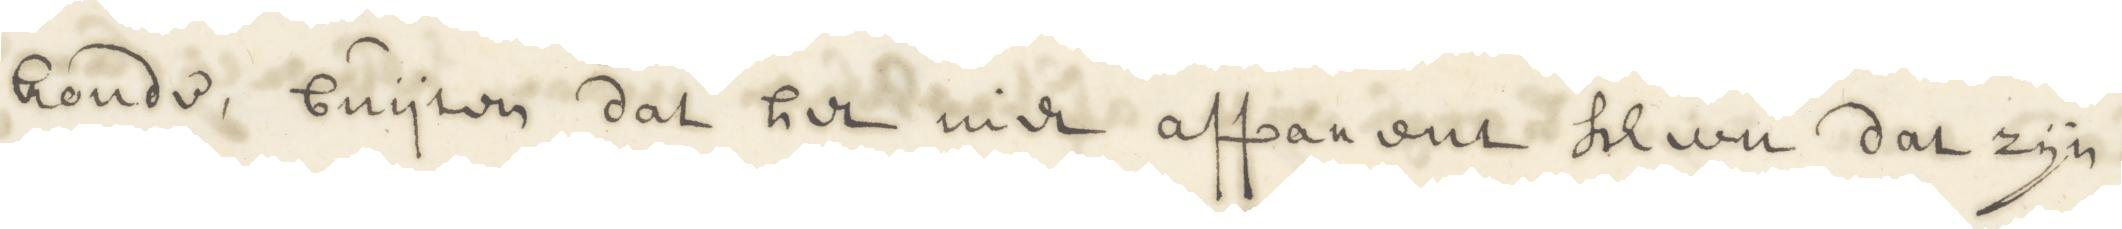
konde, buijten dat het niet apparent scheen dat zijn
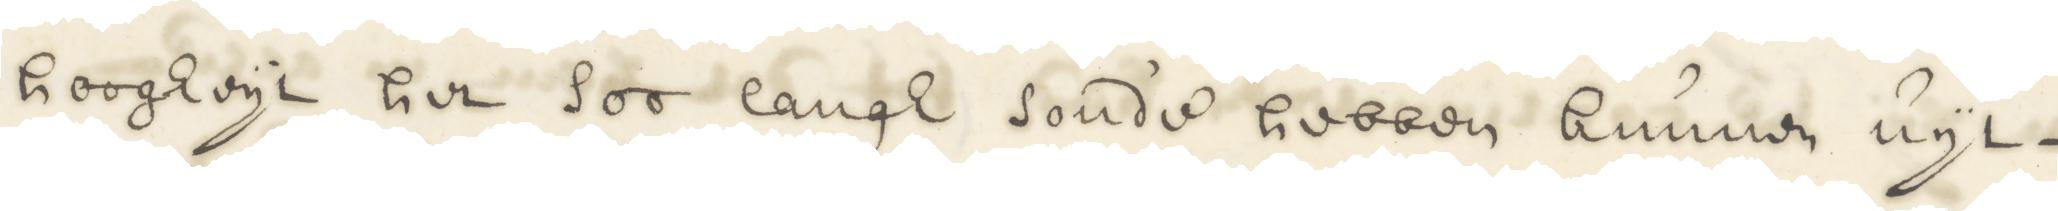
hoogheijt het soo langh soude hebben kunnen uijt –
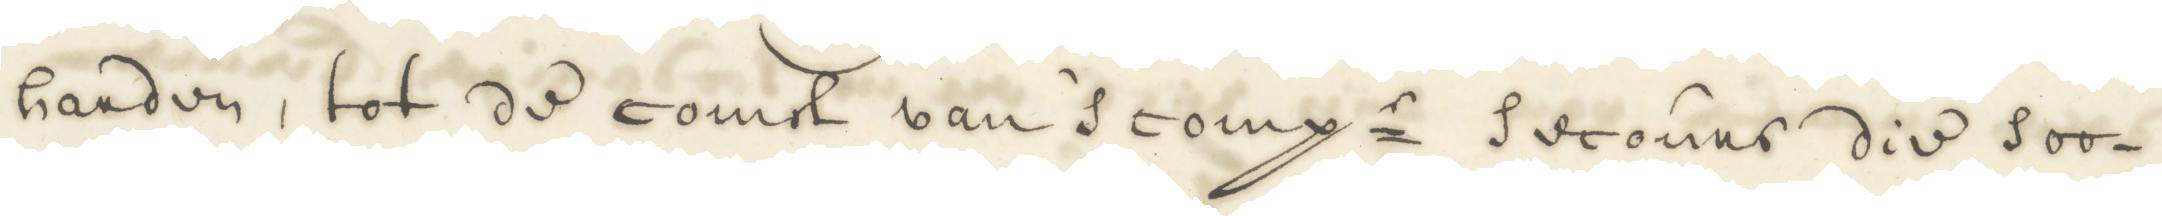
harden, tot de comst van ’s comp=s secours die soo–
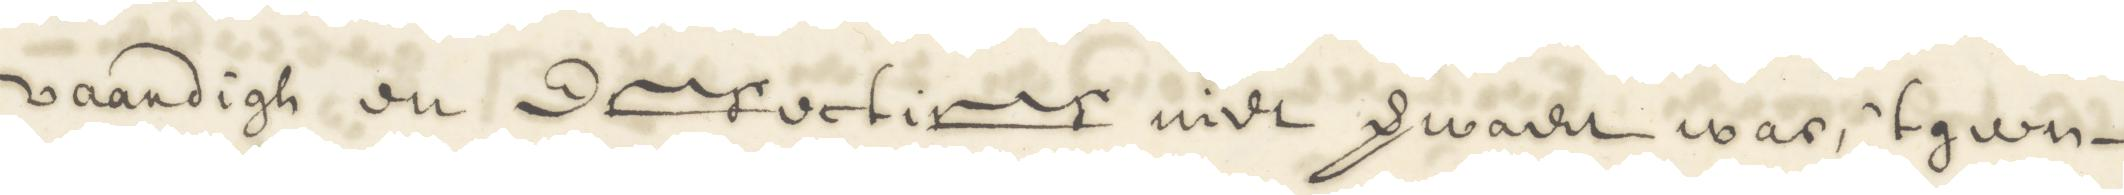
vaardigh en Effectiff niet verwaert was, 't geen –
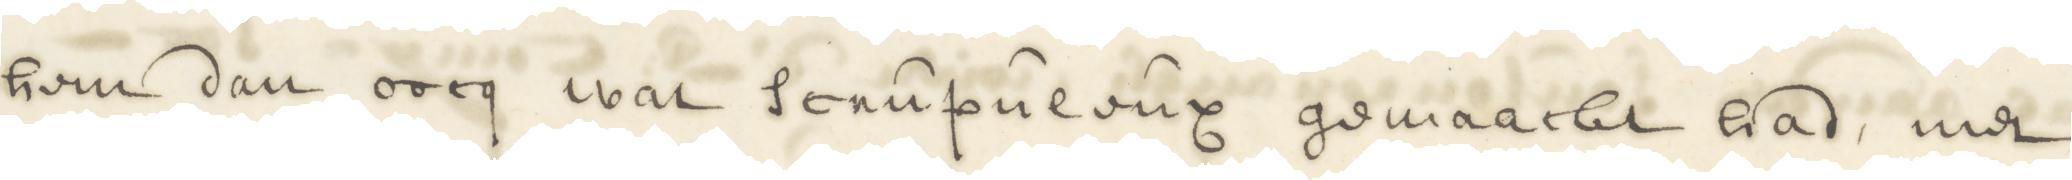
hem dan oocq wat scrupuleux gemaackt had, met
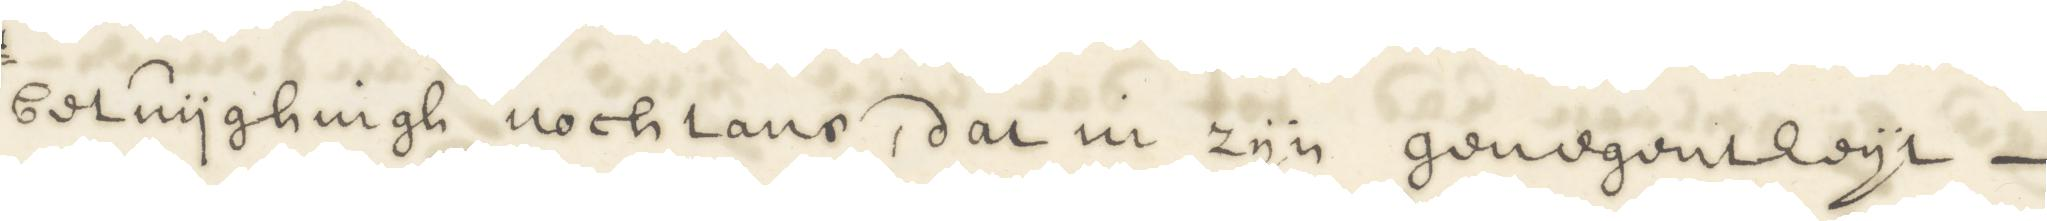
betuijghingh nochtans, dat in zijn genegentheijt –
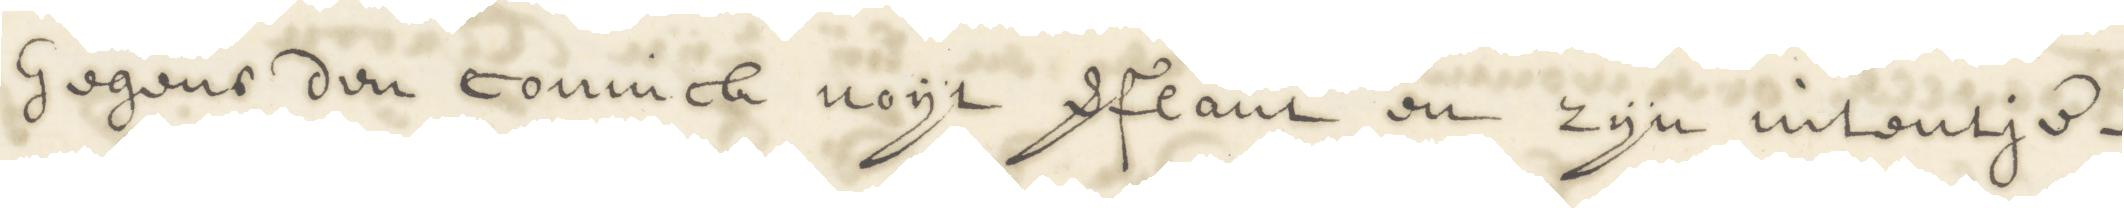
Jegens den coninck noijt verflaut en zijn intentje –
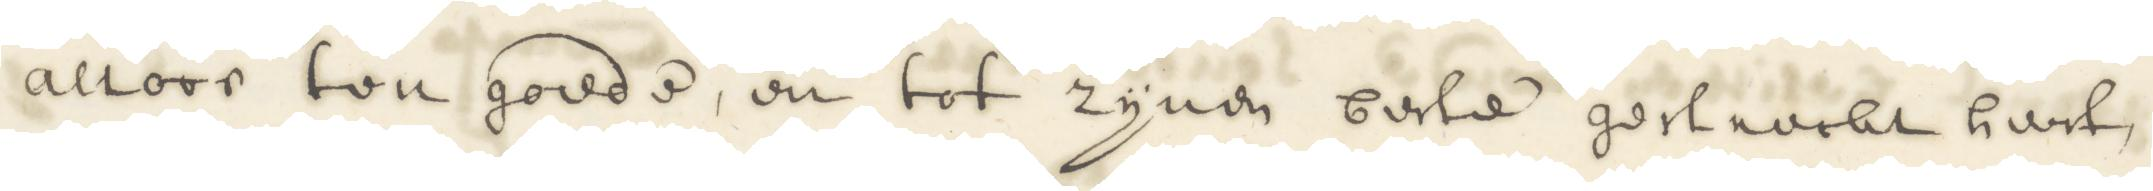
altoos ten goede, en tot zijnen beste gestreckt hert
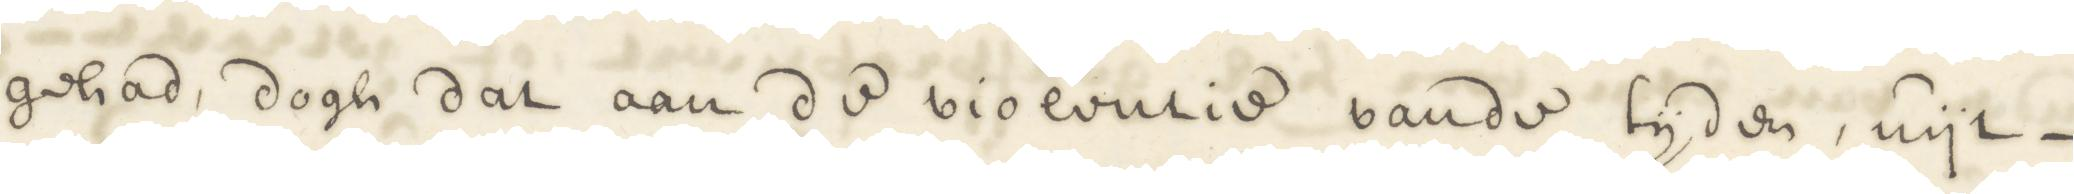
gehad, dogh dat aan de violentie vande tijden, uijt –
